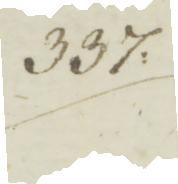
337:
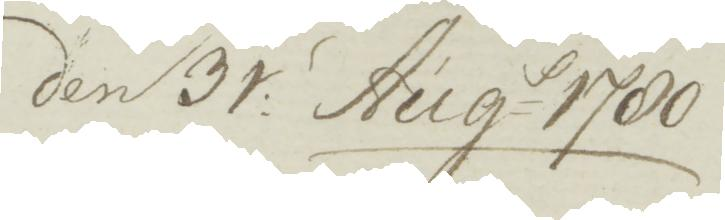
den 31:' Aug=s 1780
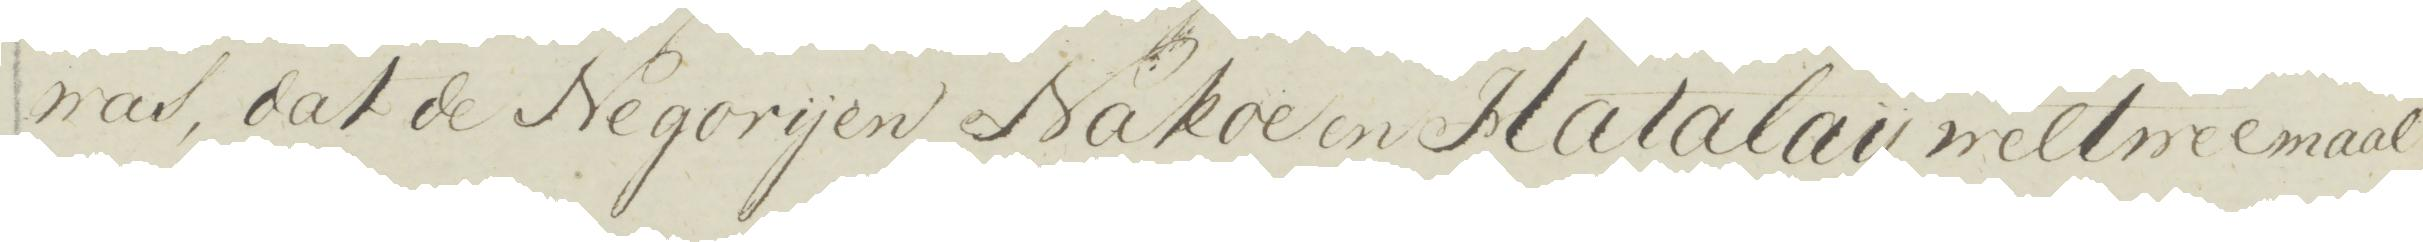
was, dat de Negorijen Nakoe en Hatalaij wel tweemaal
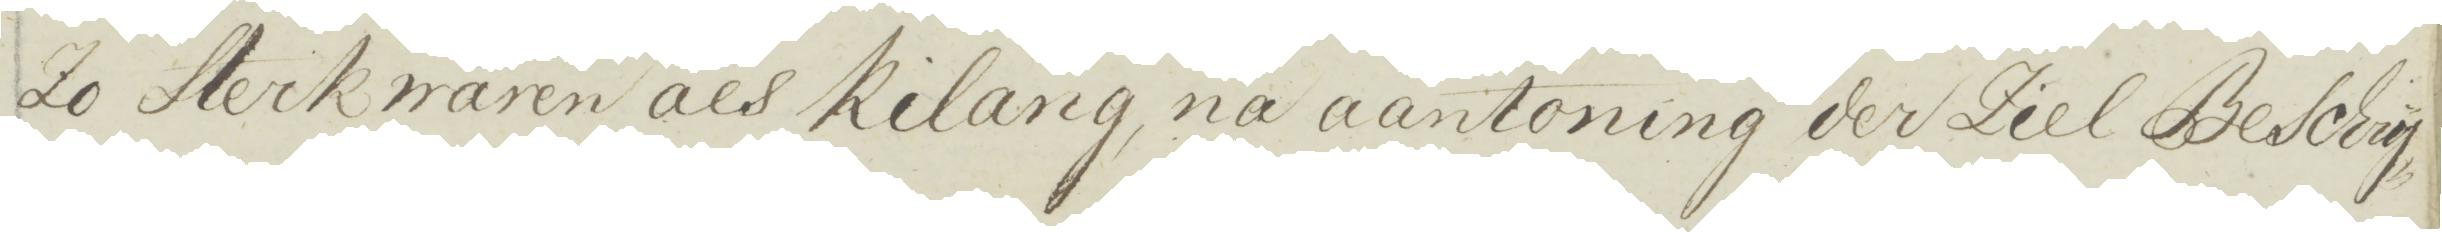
zo sterk waren als Kilang, na aantoning der Ziel Beschrij„
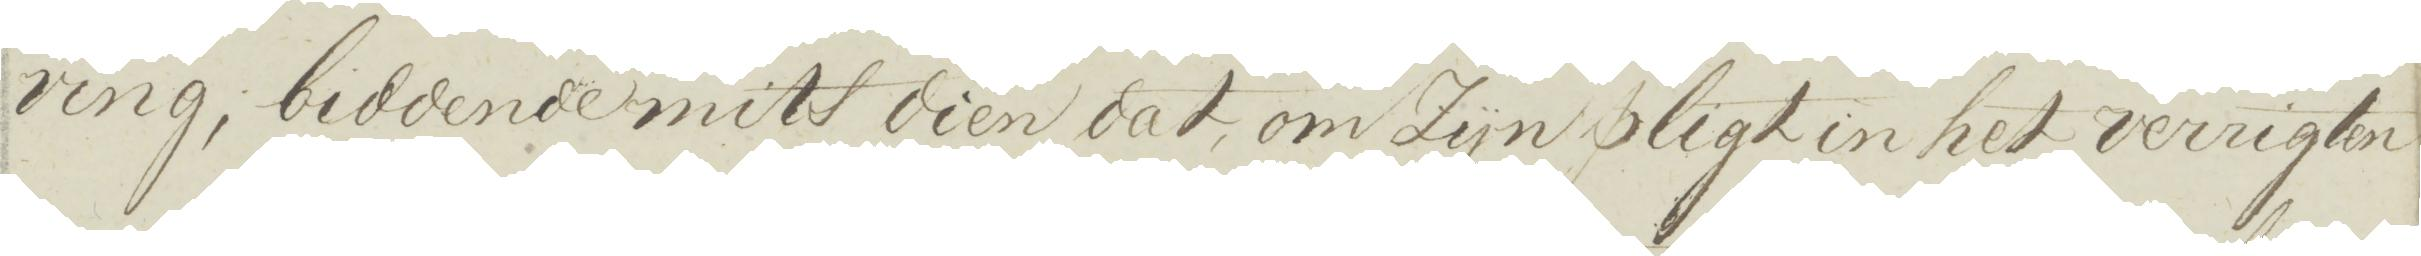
ving, biddende mits dien dat, om zijn pligt in het verrigten
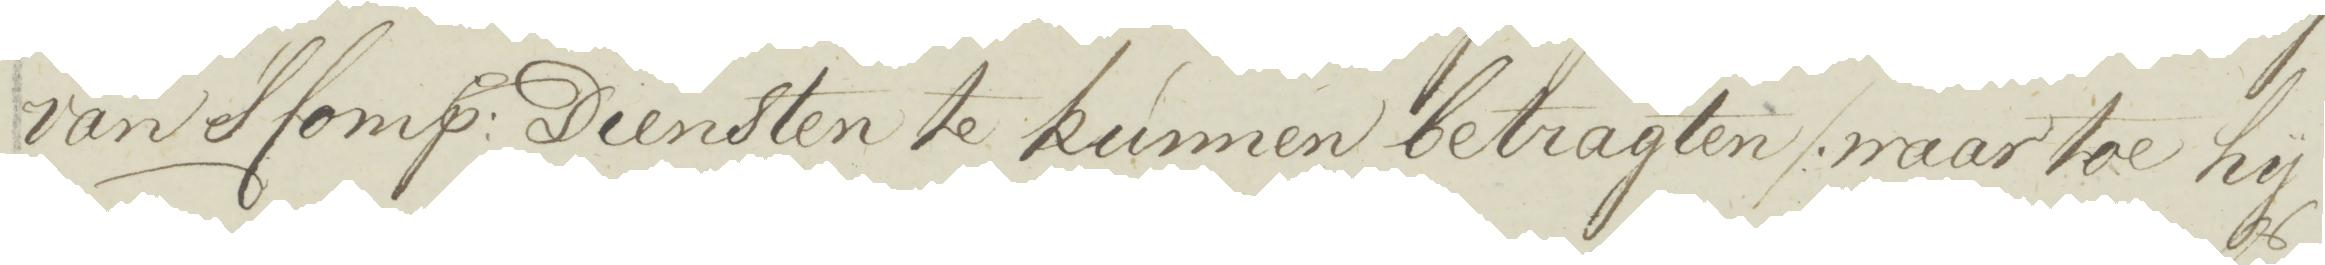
van ’s Comp:s Diensten te kunnen betragten /:waar toe hij
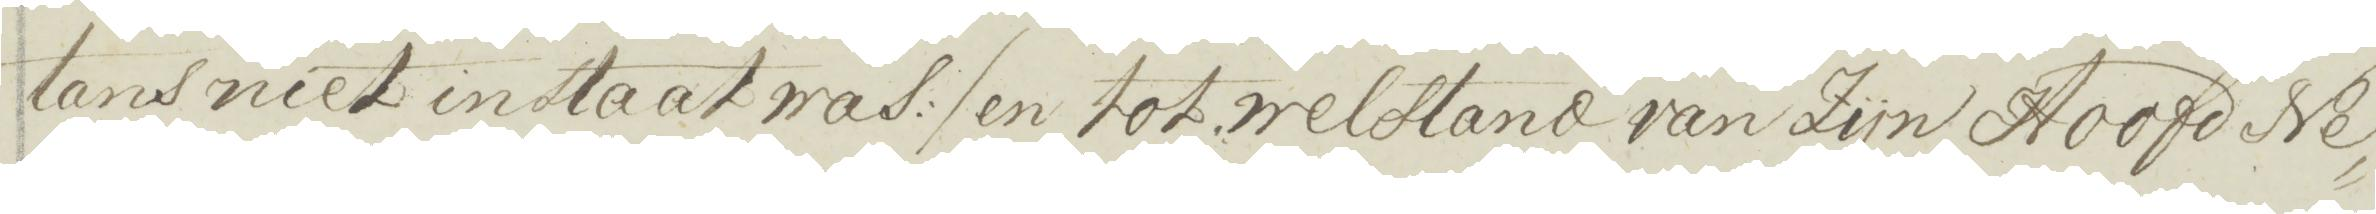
tans niet instaat was:/ en tot welstand van zijn Hoofds Ne„
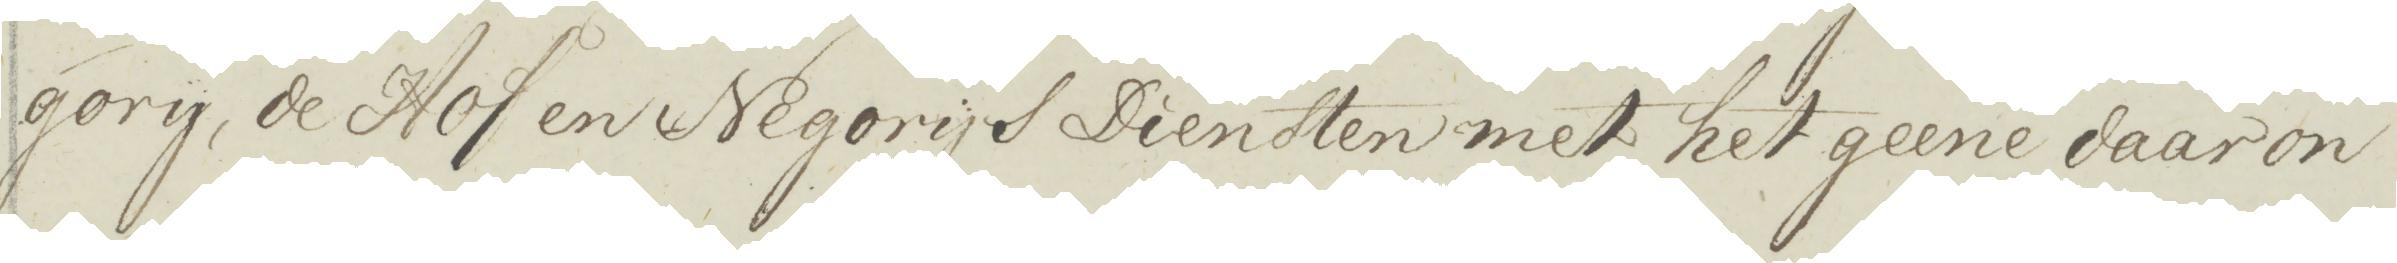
gorij, de Hof en Negorijs Diensten met het geene daar on
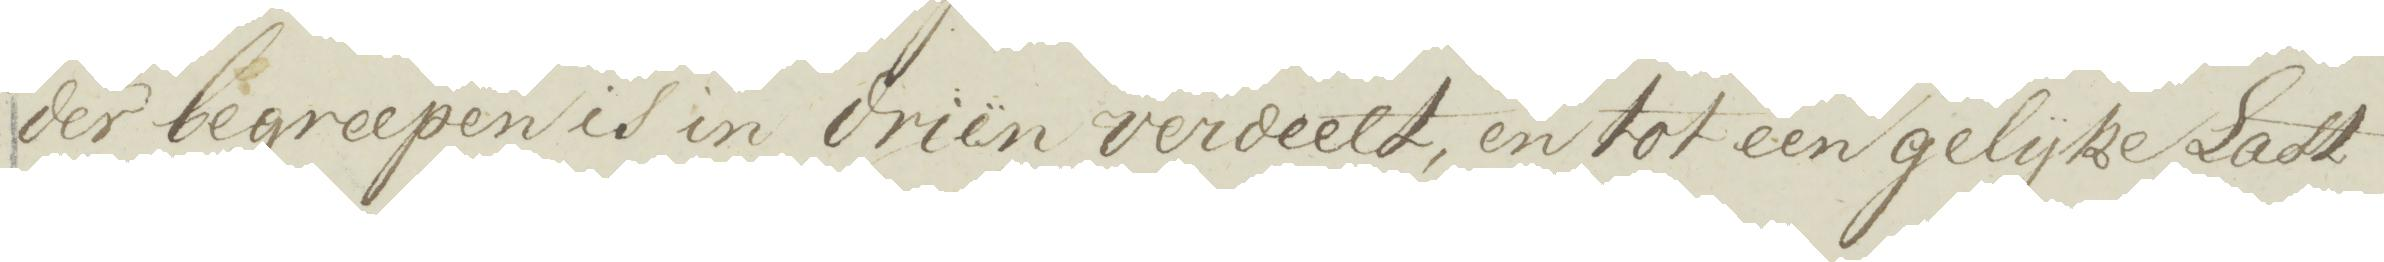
der begreepen is in driën verdeelt, en tot een gelijke Last
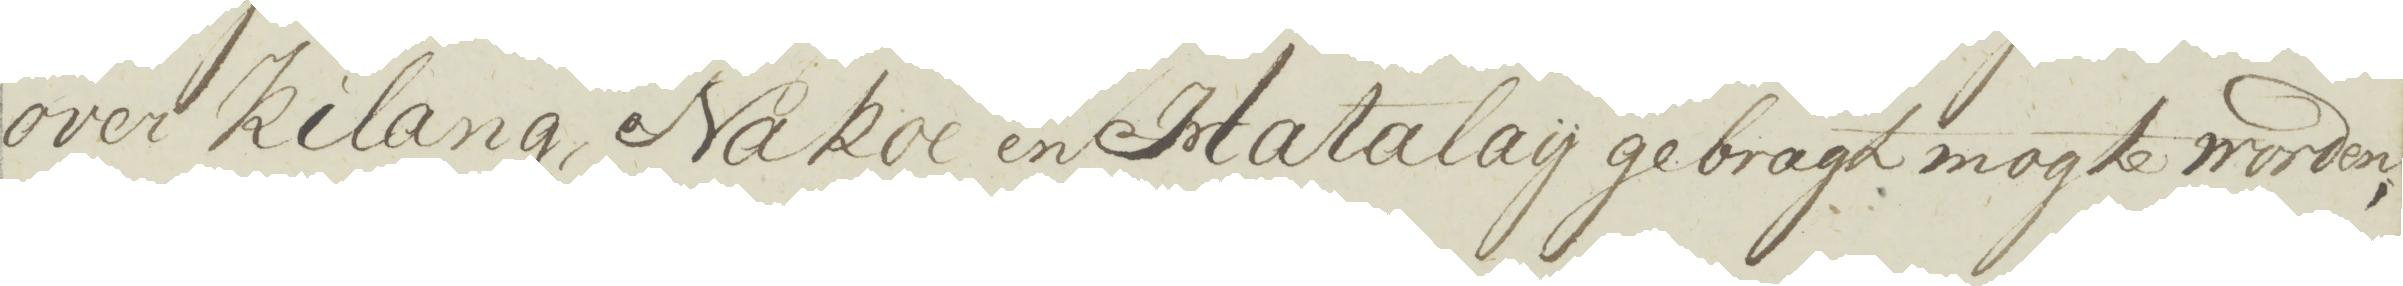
over Kilang, Nakoe en Hatalaij gebragt mogte worden,
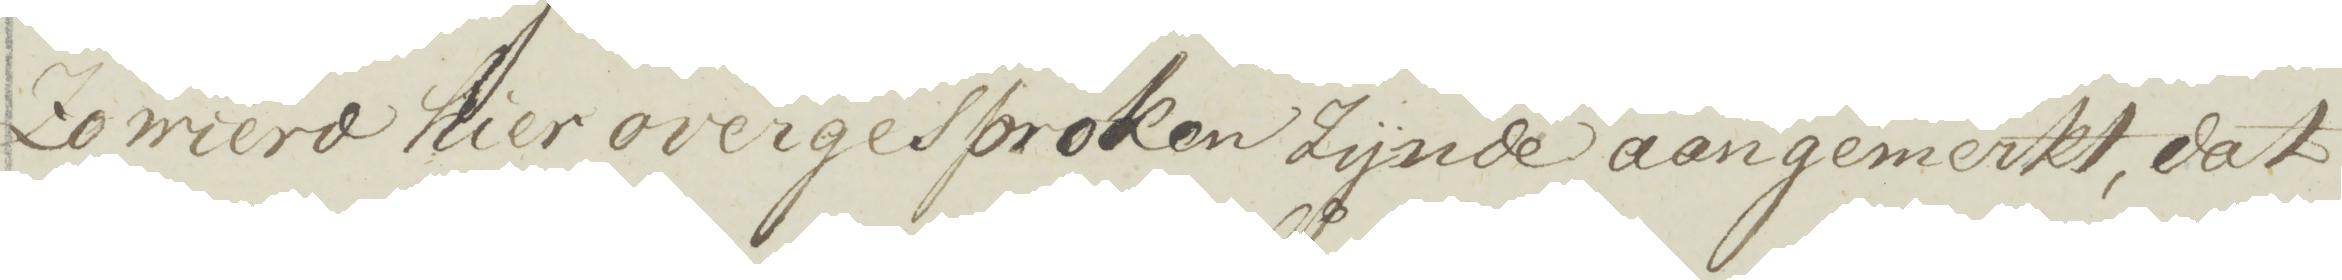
zo wierd hier over gesproken zijnde aangemerkt, dat
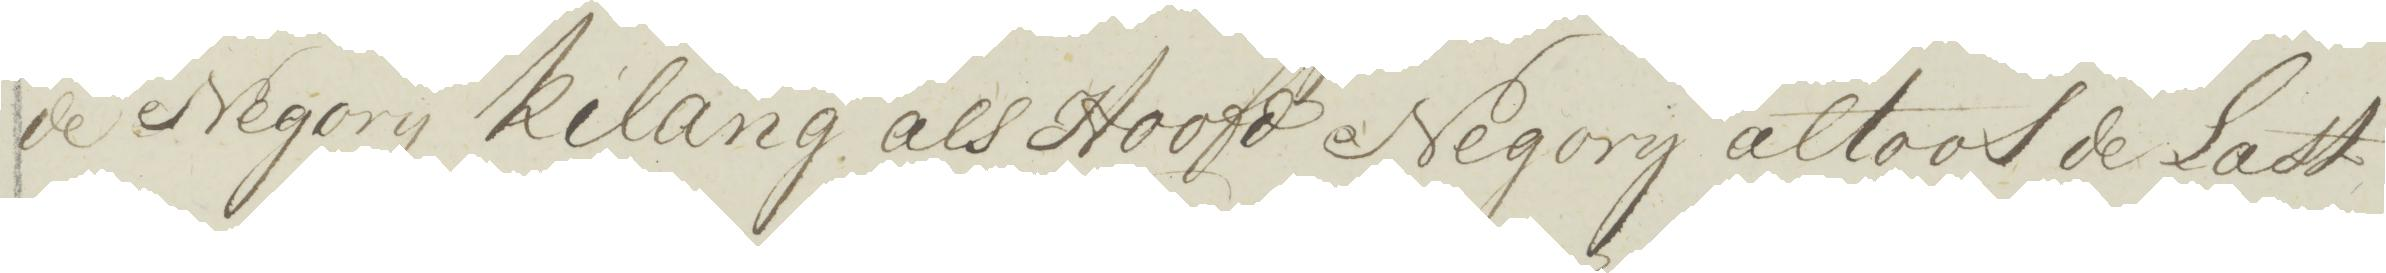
de Negorij Kilang als Hoofd' Negorij altoos de Last
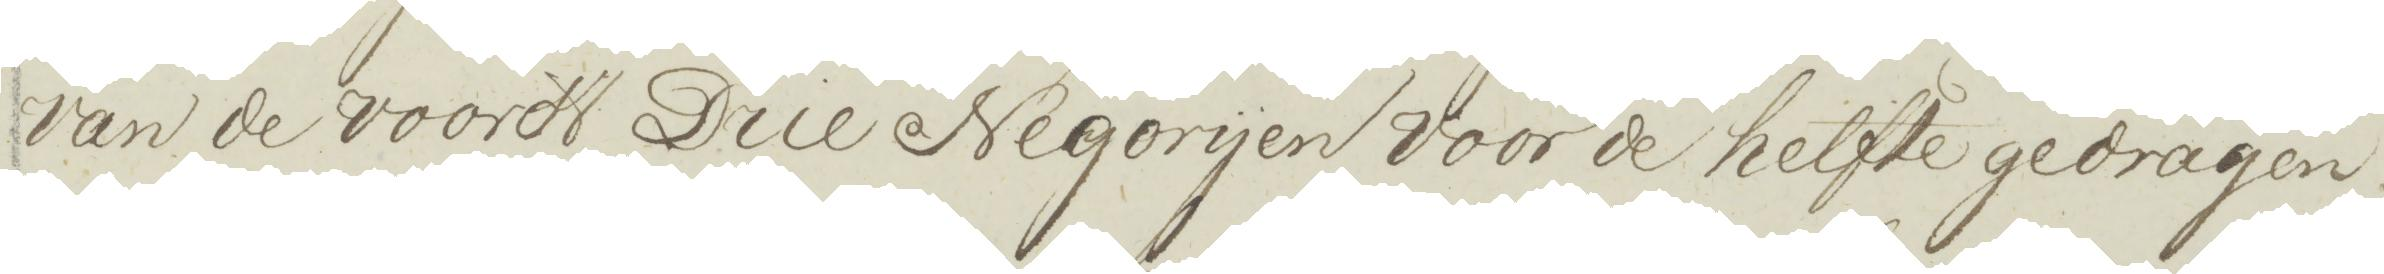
van de voords Drie Negorijen voor de helfte gedragen
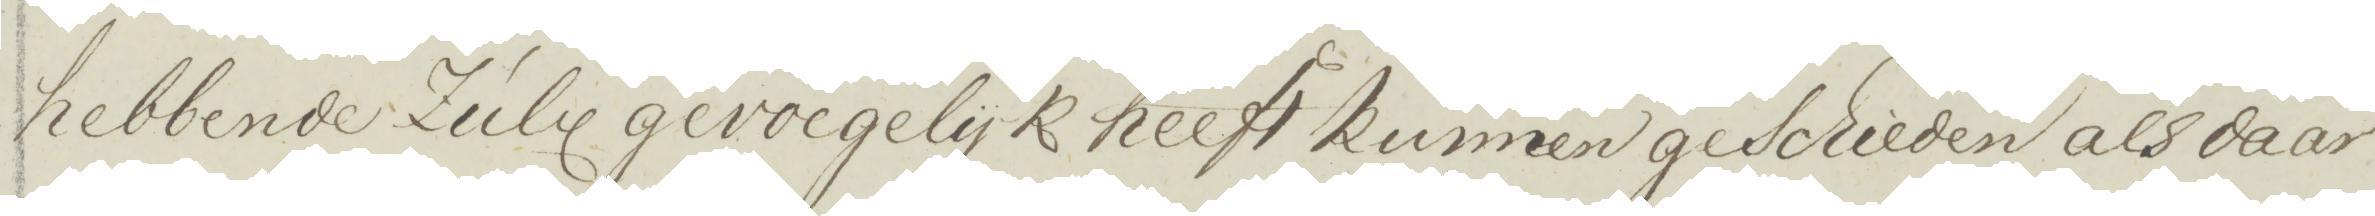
hebbende zulx gevoegelijk heeft kunnen geschieden als daar
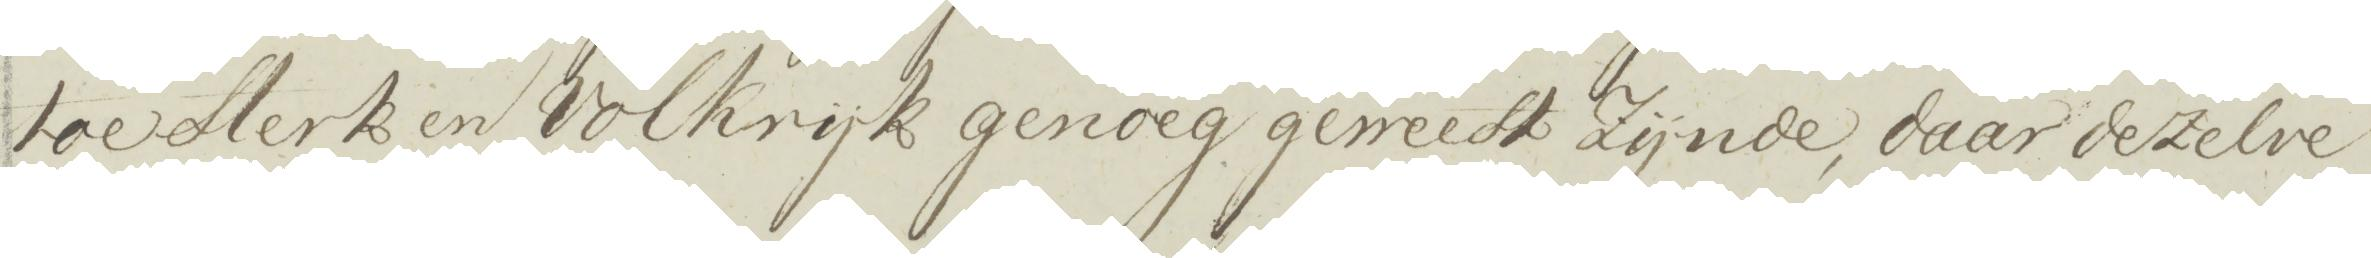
toe sterk en volkrijk genoeg geweest zijnde, daar dezelve
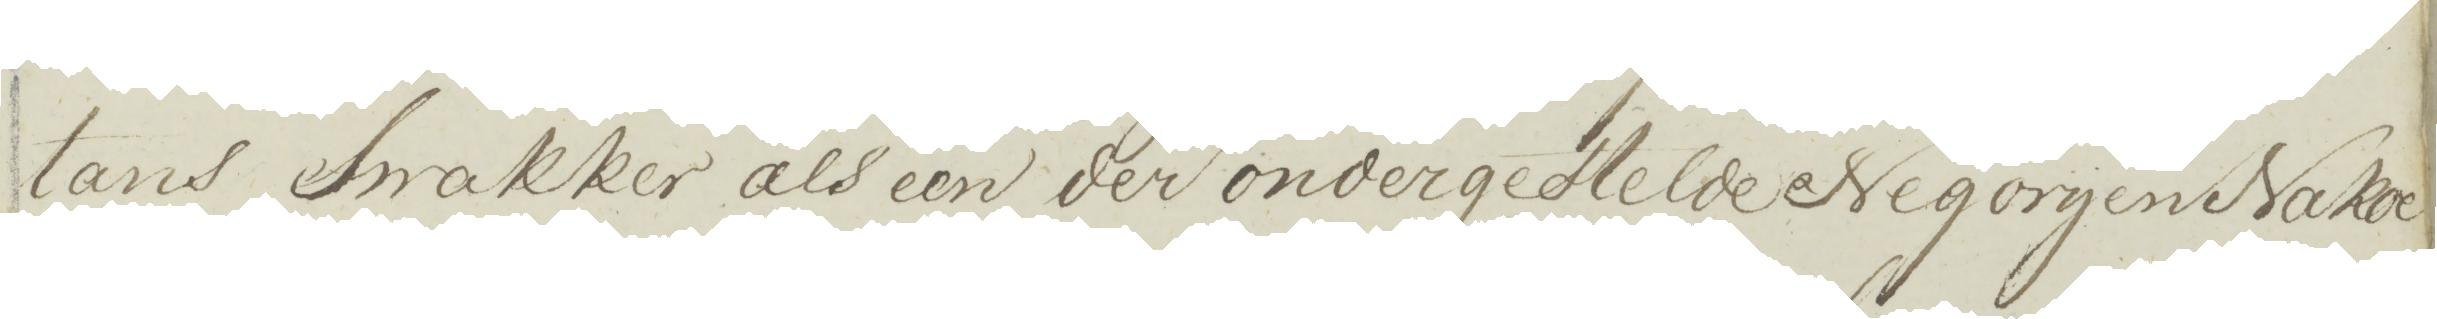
tans Swakker als een der ondergestelde Negorijen Nakoe
